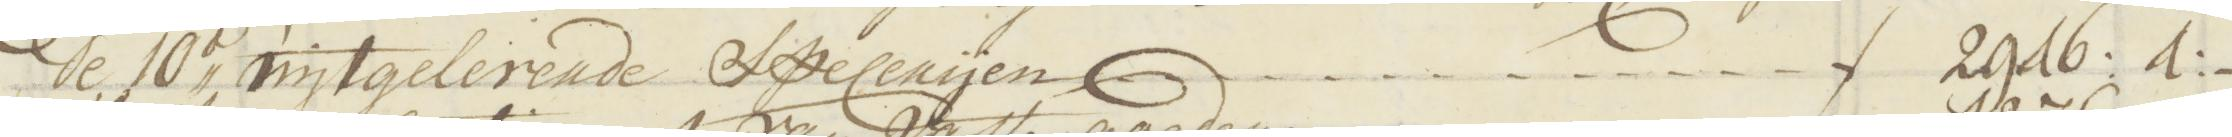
de 10„d uijtgeleverde Specerijen - - - - - - - - - - - - ƒ 2946: 4:
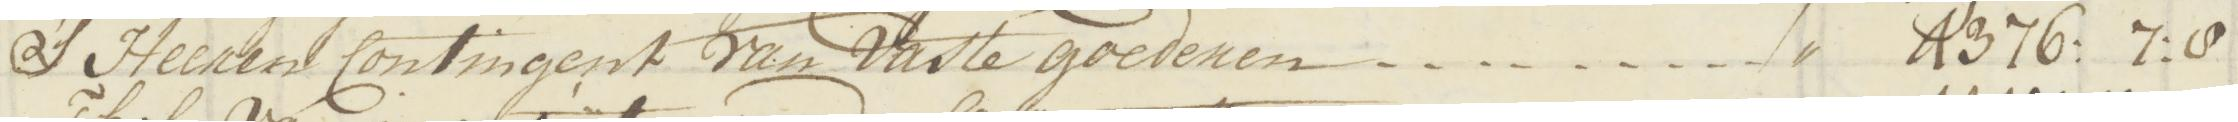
'S Heeren Contingent van vaste goederen - - . - - - - - - „ 4376: 7: 8
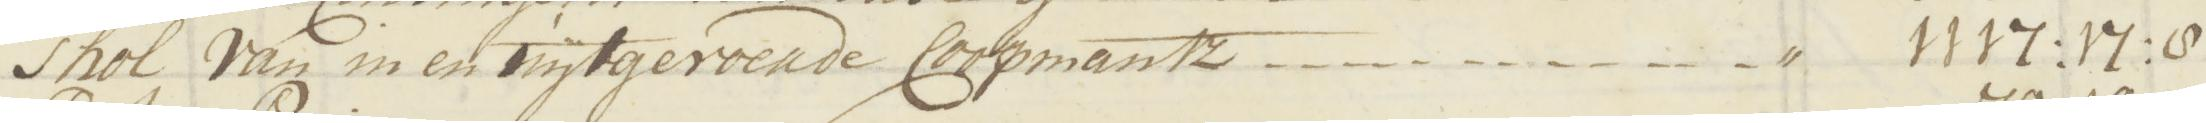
Thol van in en uijtgevoerde Coopmansz - - - - - - - - - - - - „ 1117:17:8
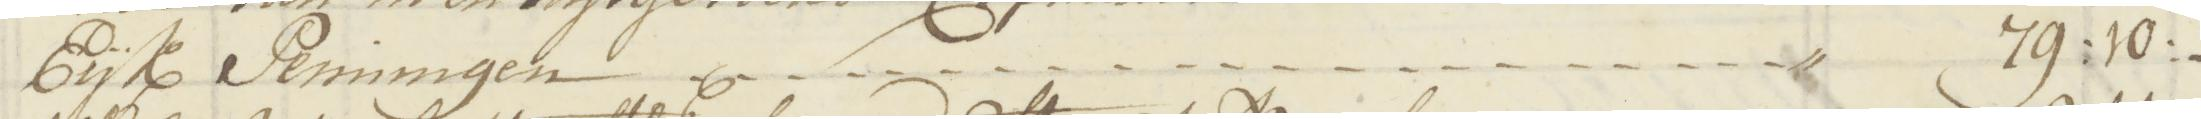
Eijk Penningen - - - - - - - - - - - - - - - - - - - - - „ 79: 10:
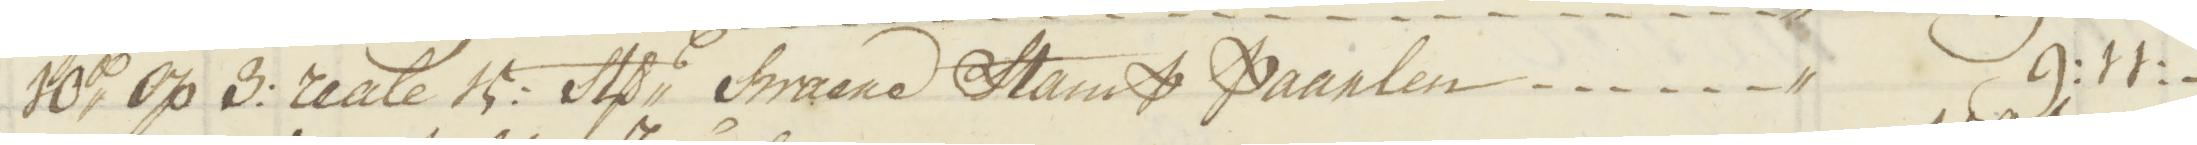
10„d op 3: reale 15: Stv„s swaere Stamp Paarlen - - - - - - „ 9: 11:
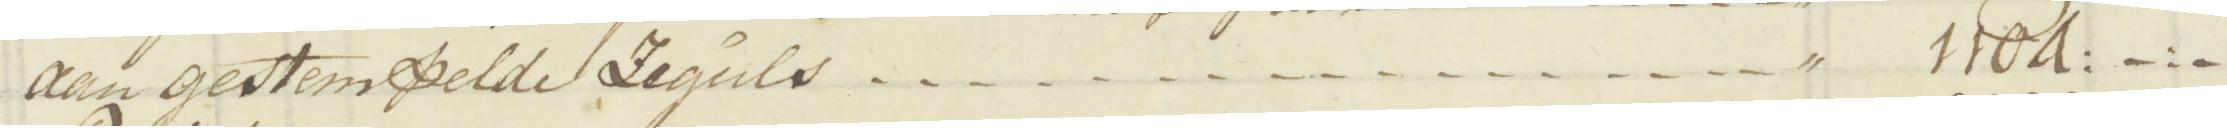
aan gestempelde Zeguls - - - - - - - - - - - - - - - - - „ 1104: —:—
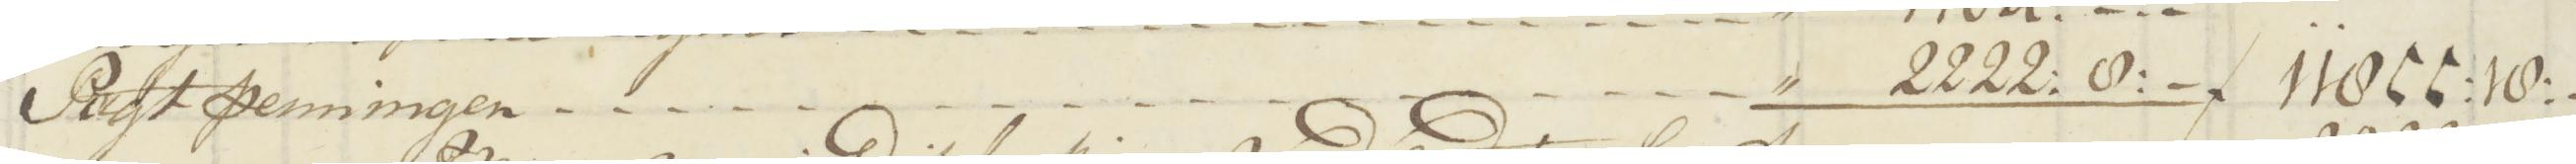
Regt penningen - - - - - - - - - - - - - - - - - - - - „ 2222:8:— ƒ 11855:18:
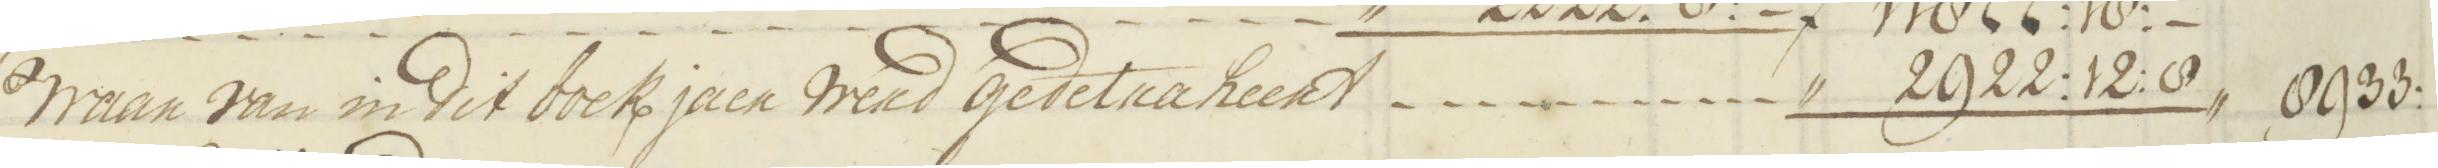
waar van in dit boek jaer werd gedetraheert - - - - - - - - - - - „ 2922:12:8 „ 8933:5:
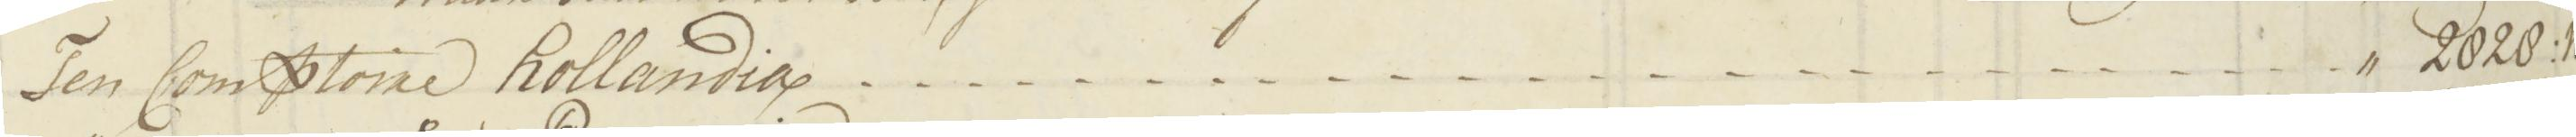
Ten Comptoire hollandia . - - - - - - - - - - - - - - - - - - - - - - - - „ 2828:
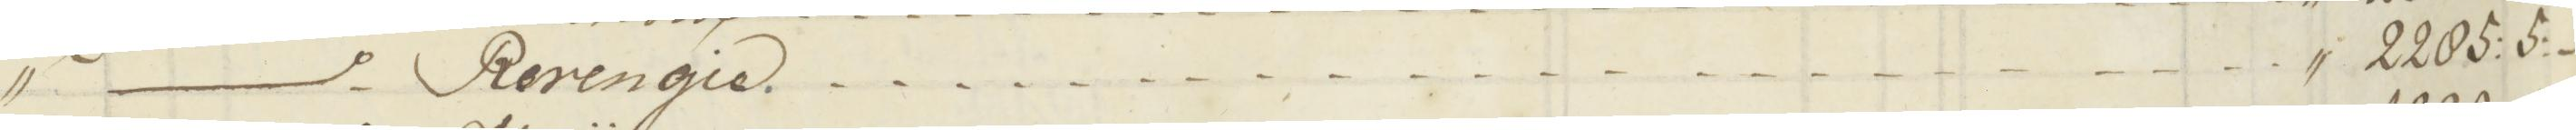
„ __o Revengie . - - - - - - - - - - - - - - - - - - - - - - . „ 2285:5:
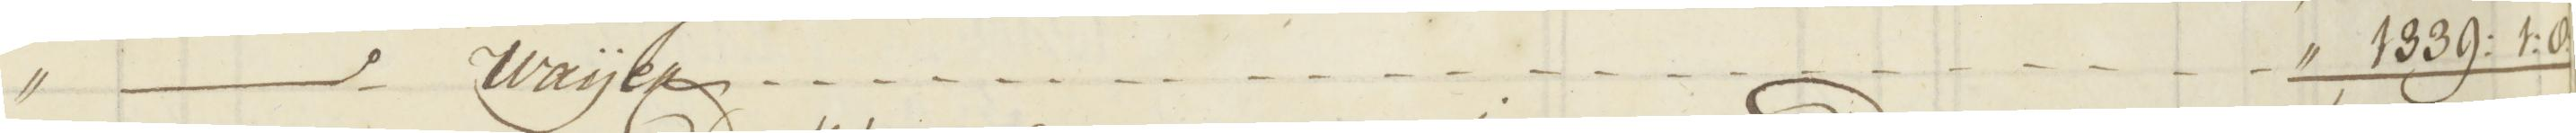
„ __o Waijer - - - - - . - - - - - - - - - - - - - - - - - - „ 1339:1:8
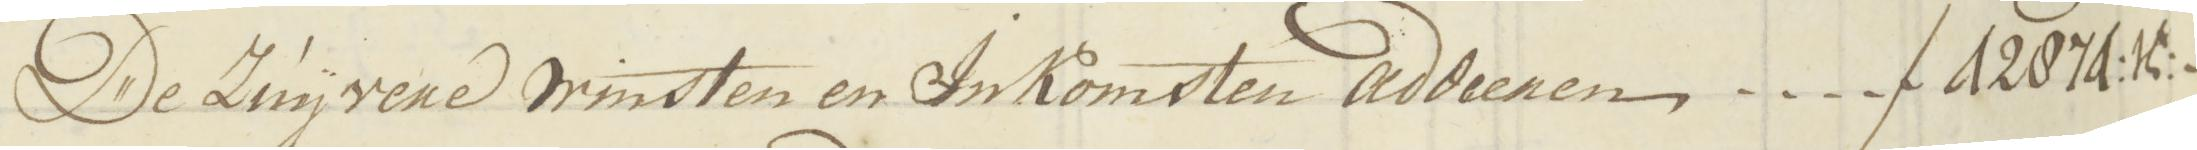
De Zuijvere winsten en Inkomsten addeeren - - - - ƒ42874:15:-
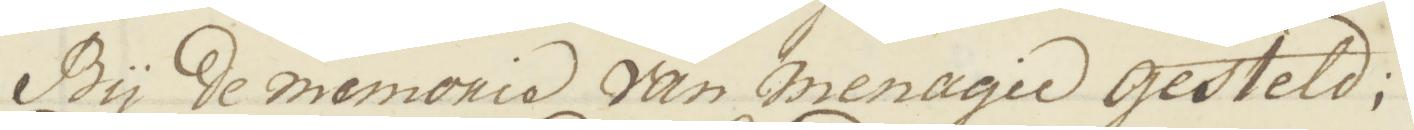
Bij de memorie van menagie gesteld;
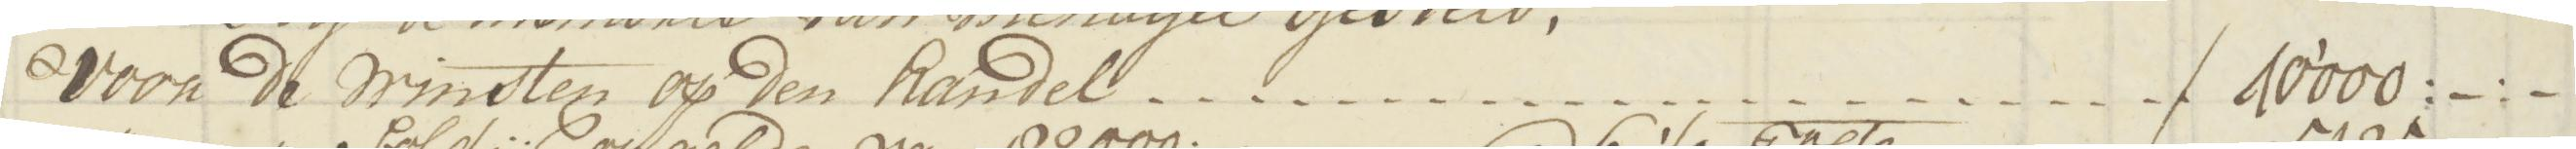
Voor de winsten op den handel - - - - - - - - - - - - - - - - - - - - - ƒ 40'000:—:—
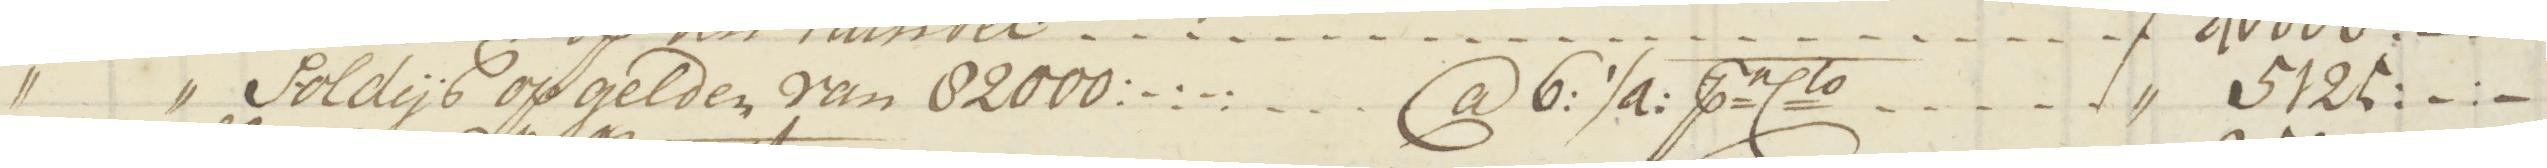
„ „ Soldijs op gelden van 82000:-:-: - - . @ 6: ¼: p=r C=to - - - - - „ 5125:-:-
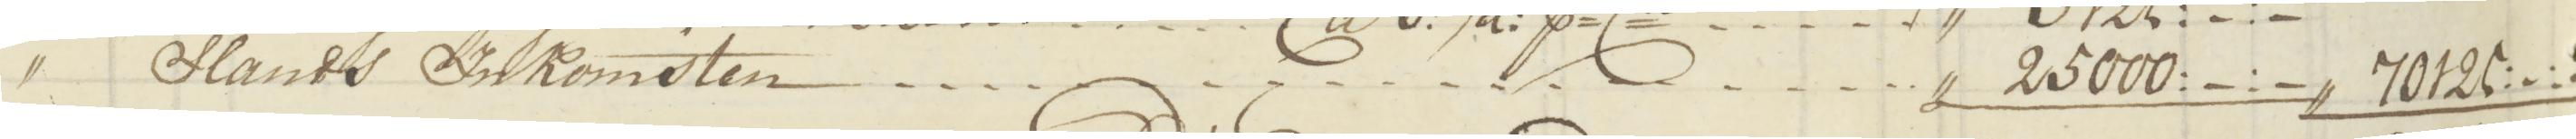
„ slands Inkomsten - - - - - - - - - - - - - - - - - - - . „ 25000: —:—„ 70125:-:
